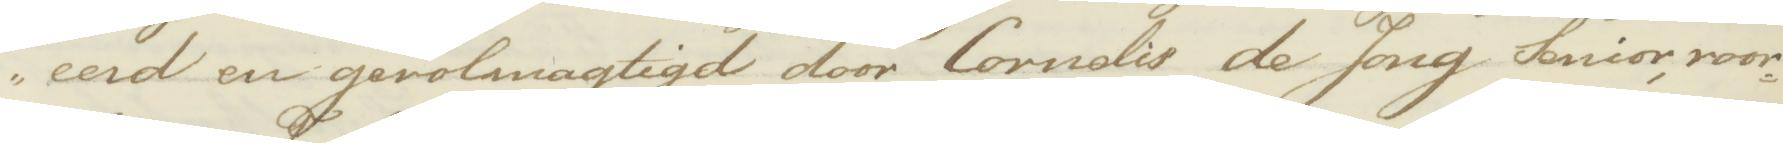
„eerd en gevolmagtigd door Cornelis de Jong senior, voor„
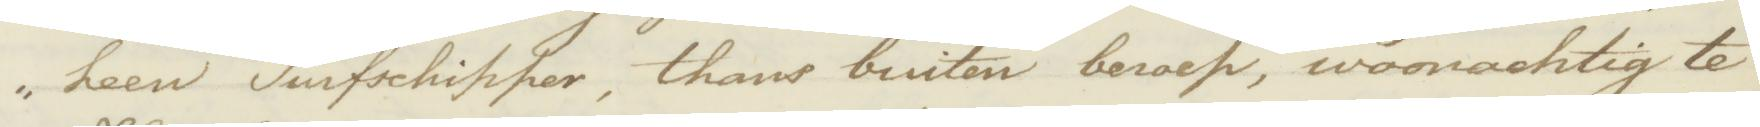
„heen Turfschipper, thans buiten beroep, woonachtig te
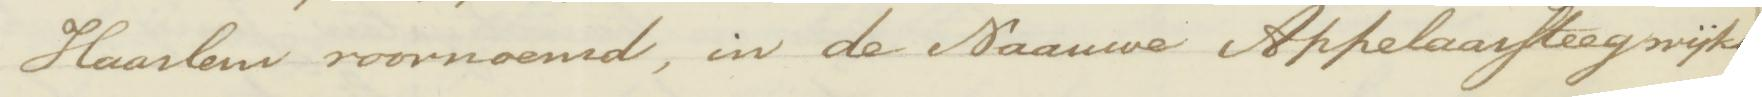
Haarlem voornoemd, in de Naauwe Appelaarsteeg wijk1
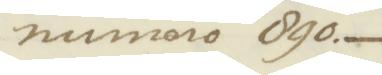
numero 890.—
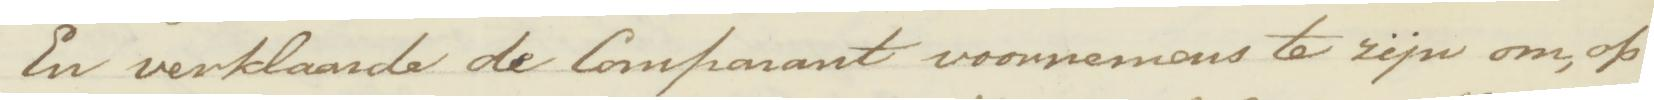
En verklaarde de Comparant voornemens te zijn om, op
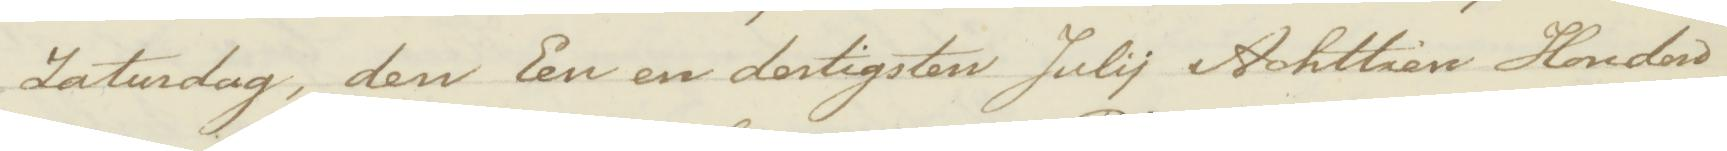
Zaturdag, den Een en dertigsten Julij Achttien Honderd
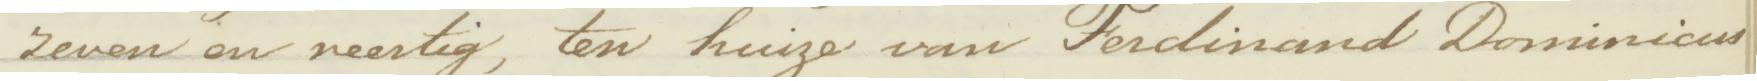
zeven en veertig, ten huize van Ferdinand Dominicus
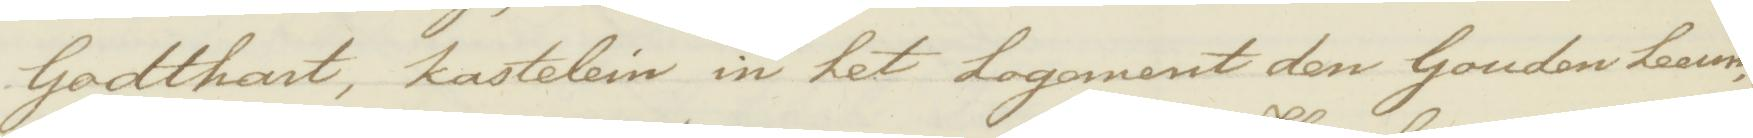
Godthart, kastelein in het Logement den Gouden Leeuw,
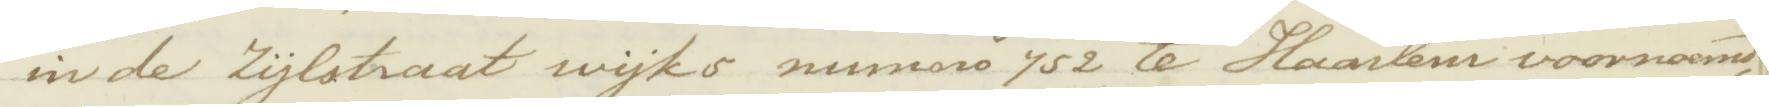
in de Zijlstraat wijk 5 numero 752 te Haarlem voornoemd,
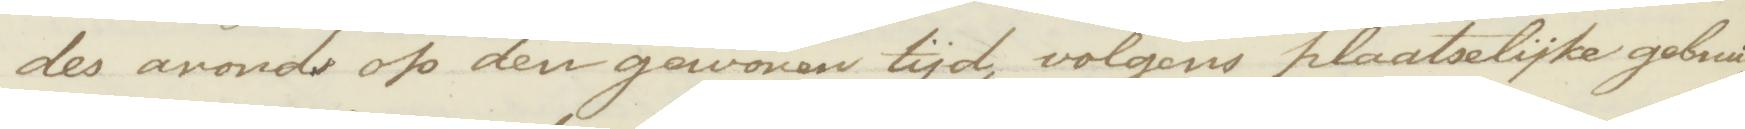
des avonds op den gewonen tijd, volgens plaatselijke gebrui
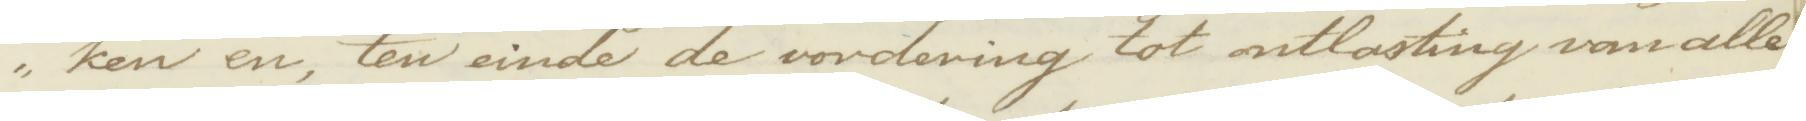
„ken en, ten einde de vordering tot ontlasting van alle
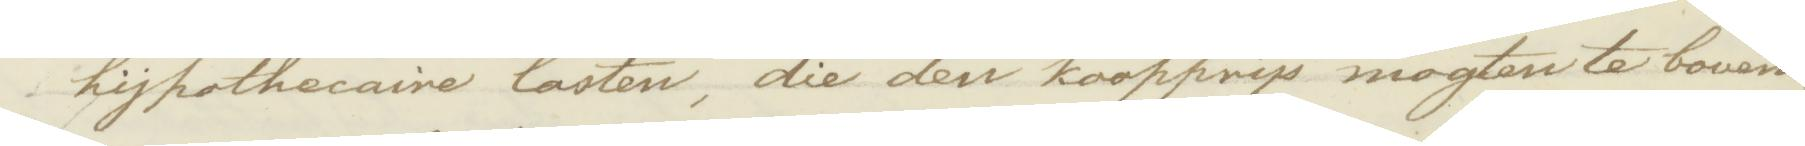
hijpothecaire lasten, die den koopprijs mogten te boven
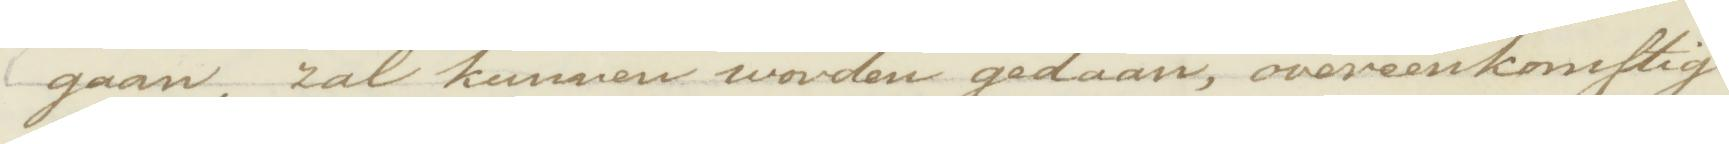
gaan, zal kunnen worden gedaan, overeenkomstig
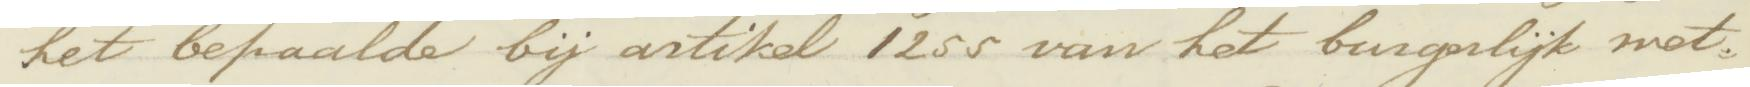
het bepaalde bij artikel 1255 van het burgerlijk wet„
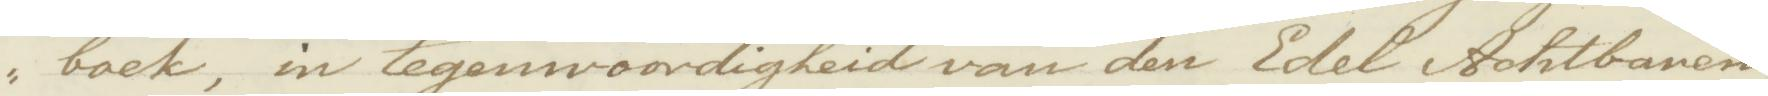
„boek, in tegenwoordigheid van den Edel Achtbaren
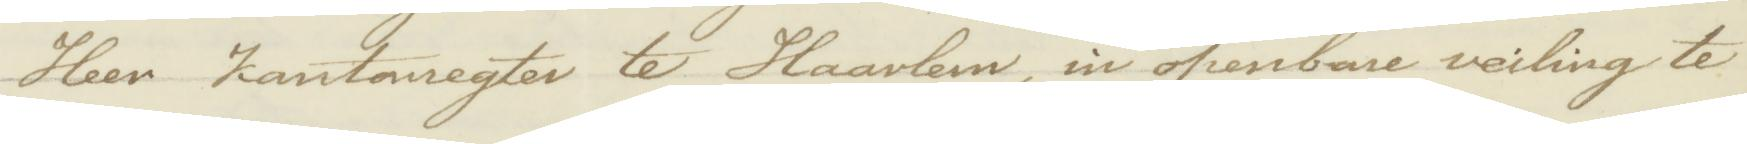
Heer Kantonregter te Haarlem, in openbare veiling te
